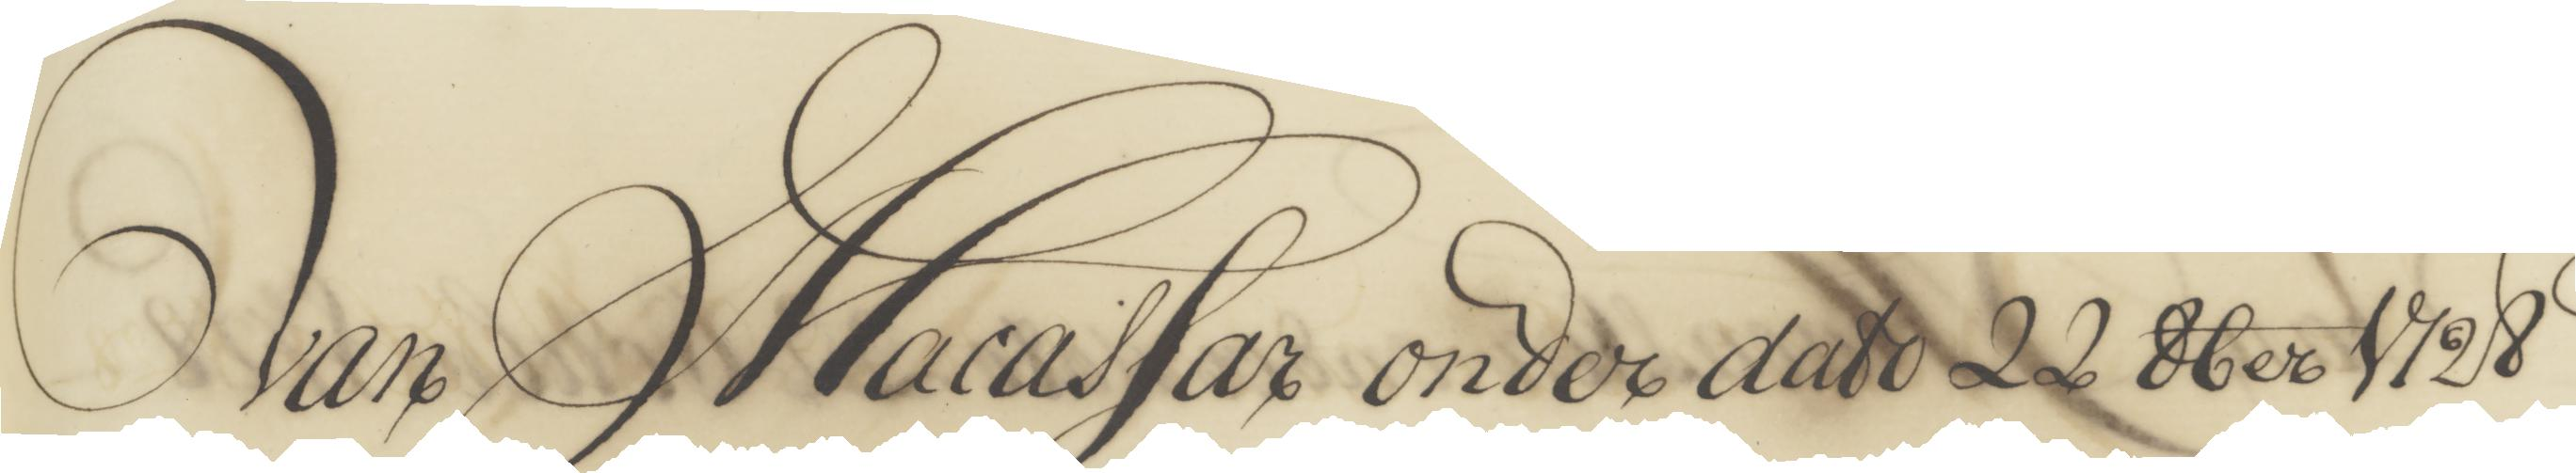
Van Macassar onder dato 22 8ber 1728
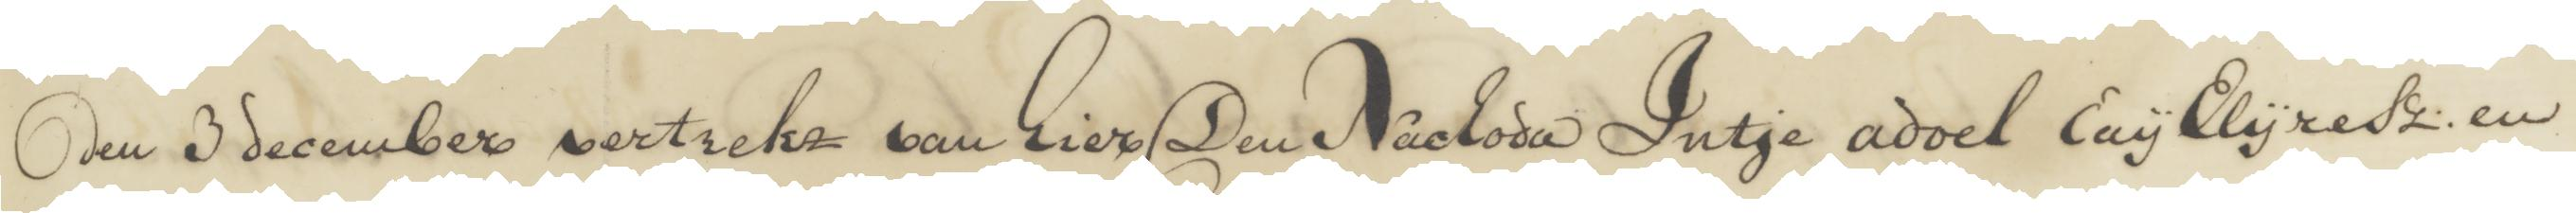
den 3 december vertrekt van hier Den Nachoda Intje adoel Caij Elijresz: en
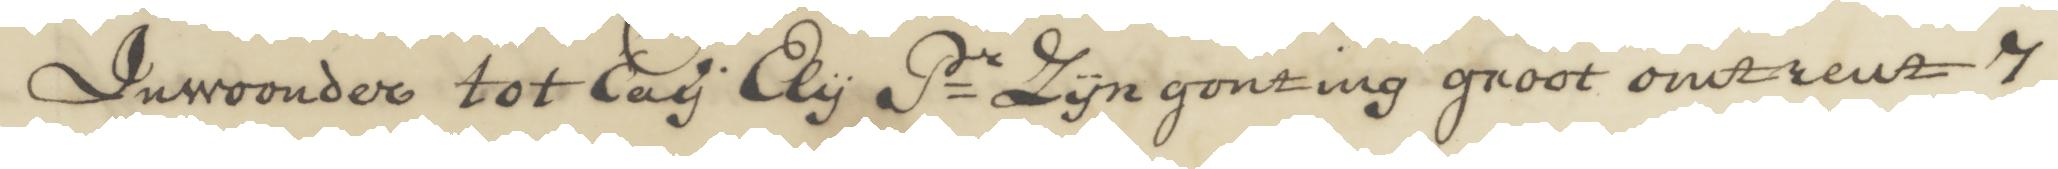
Inwoonder tot Caij Elij P=r zijn gonting groot omtrent 7
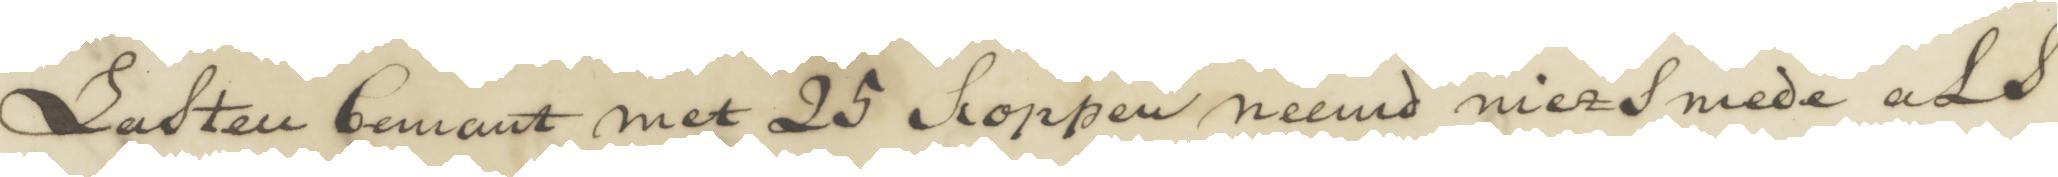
Lasten bemant met 25 koppen neemd niets mede als
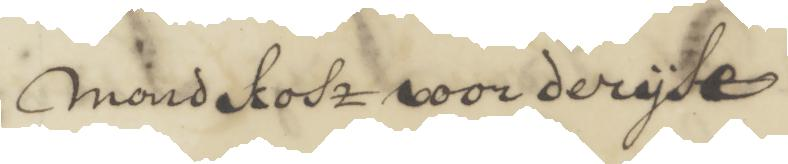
mond kost voor de rijse
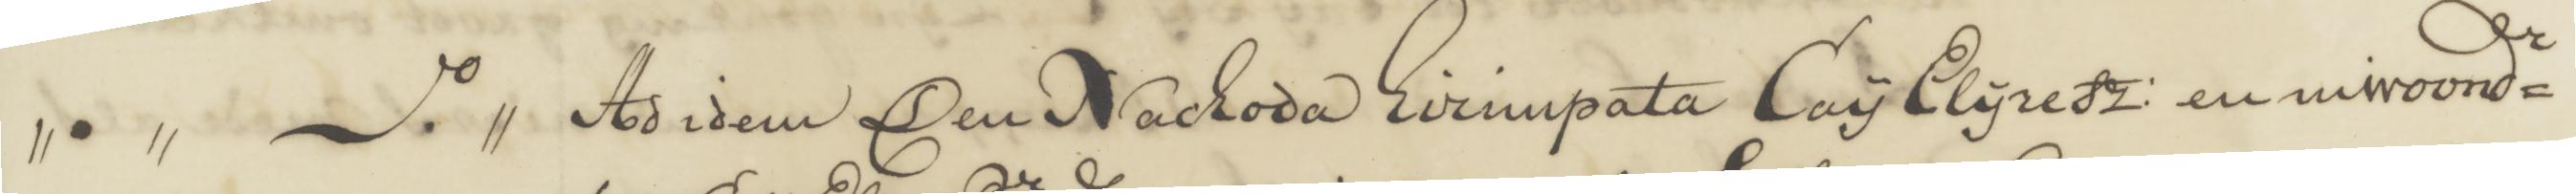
„ „ _o „ Ad idem Den Nachoda hirimpata Caij Elijresz: en inwoord=r
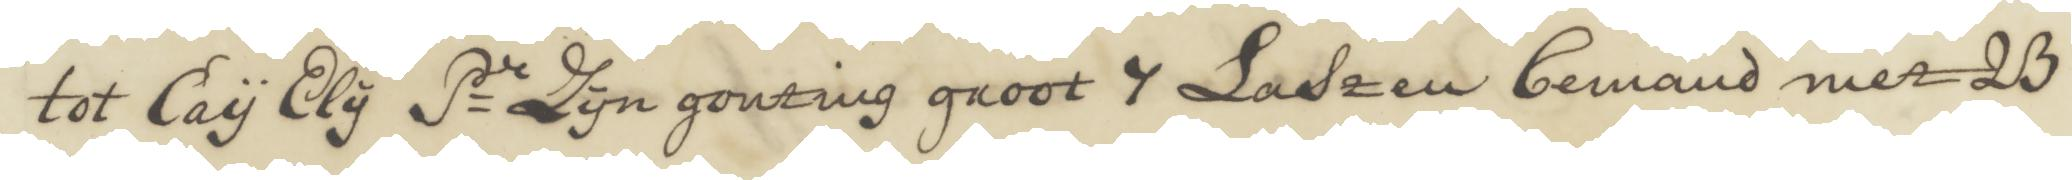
tot Caij Elij P=r zijn gonting groot 7 Lasten bemand met 23
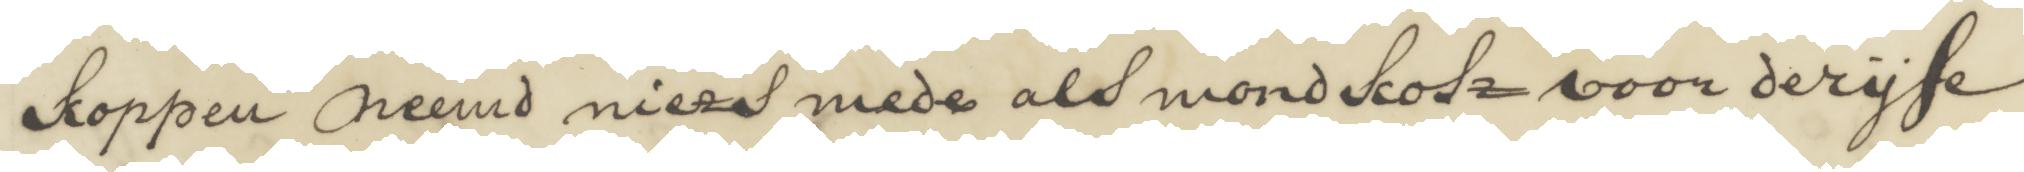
koppen neemd niets mede als mond kost voor de rijse
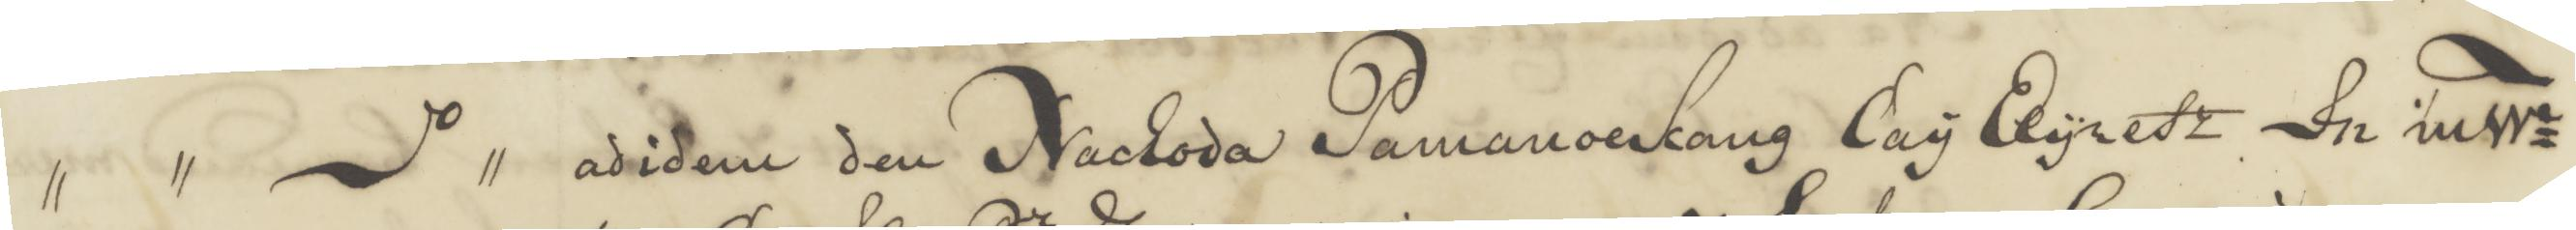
„ „ _o „ ad idem den Nachoda Pamanoekang Caij Elijresz En inw=r
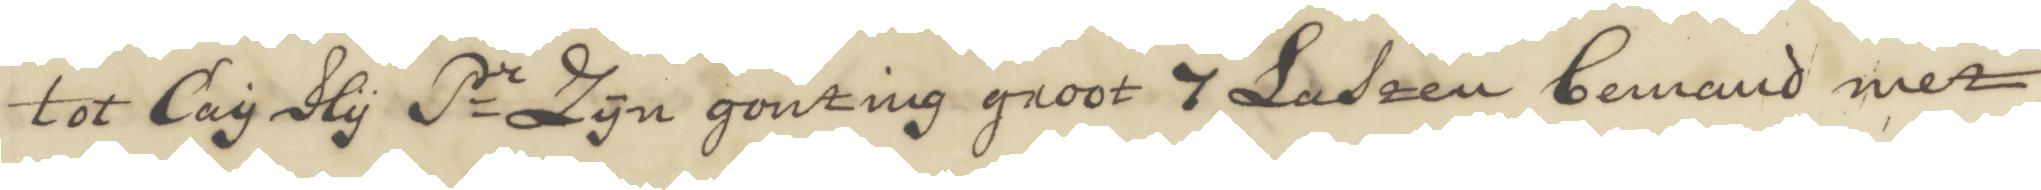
tot Caij Elij P=r zijn gonting groot 7 Lasten bemand met
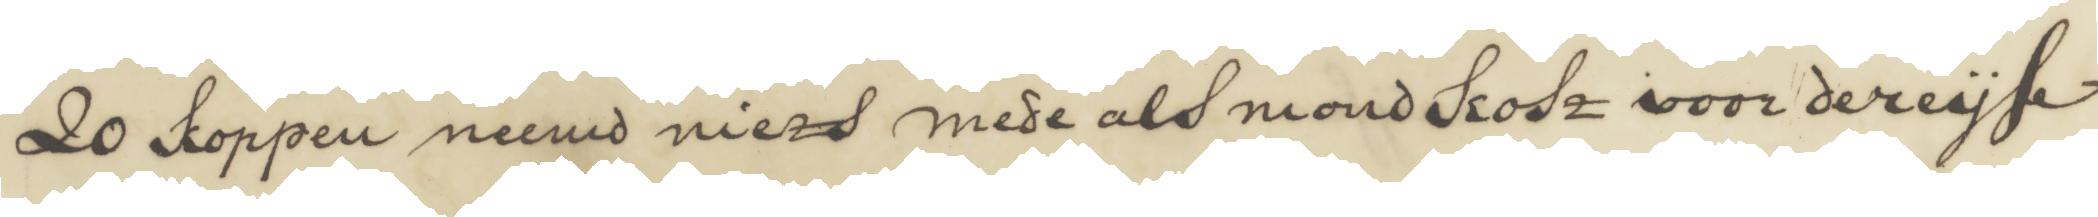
20 koppen neemd niets mede als mond kost voor dereijse
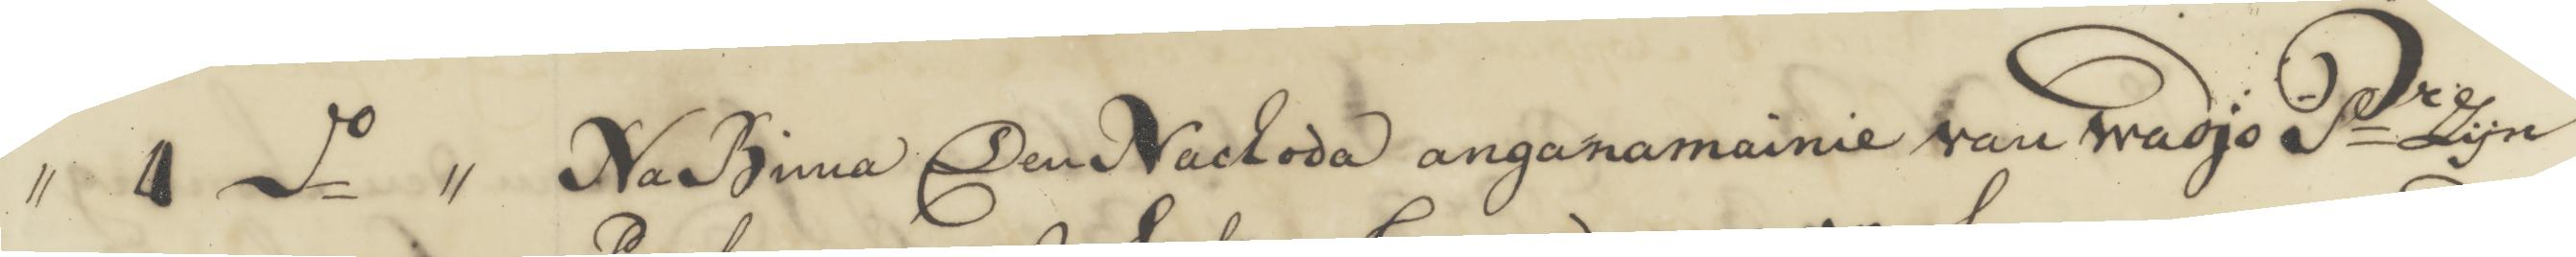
„ 4 _=o „ Na Bima den Nachoda anganamainie van wadjo P=r zijn
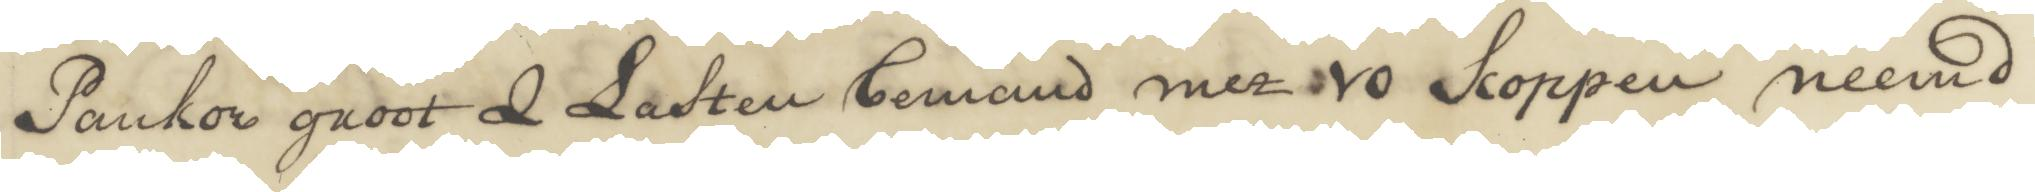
Pankor groot 2 Lasten bemand met 10 koppen neemd
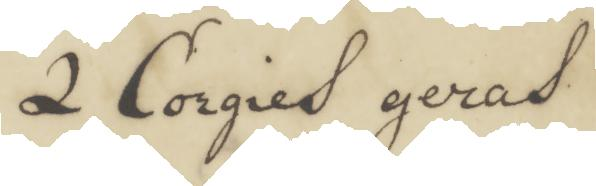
2 Corgies geras
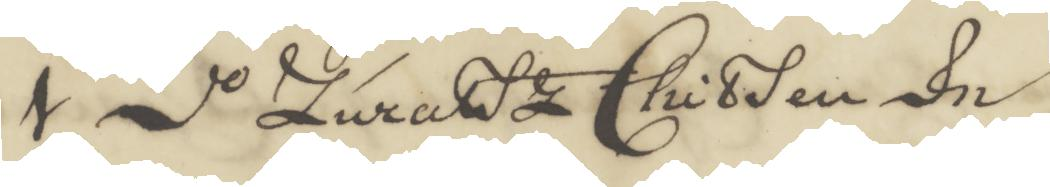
1 _o Zuratsz Chissen En
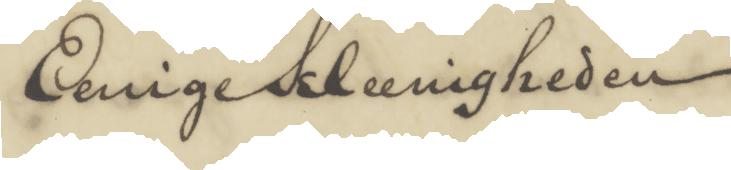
Eenige kleenigheden
